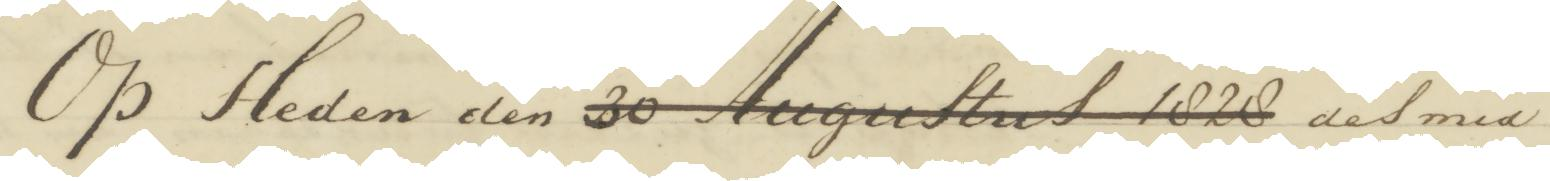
Op Heden den 30 Augustus 1828 des mid
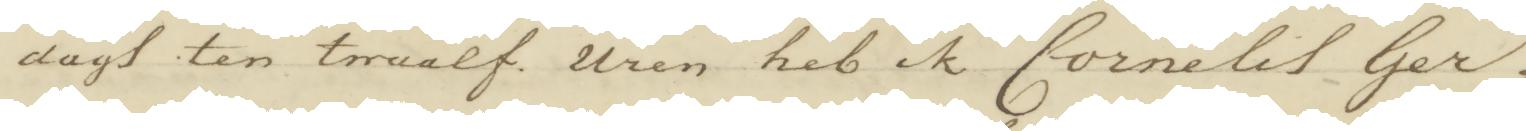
dags ten twaalf uren heb ik Cornelis Ger„
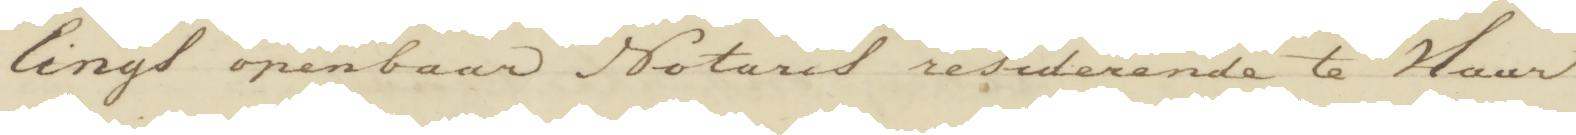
lings openbaar Notaris residerende te Haar
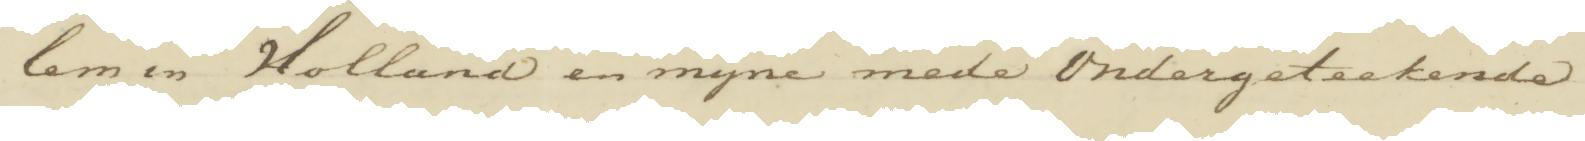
lem in Holland en mijne mede ondergeteekende
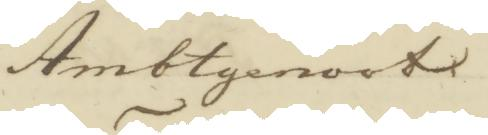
Ambtgenoot
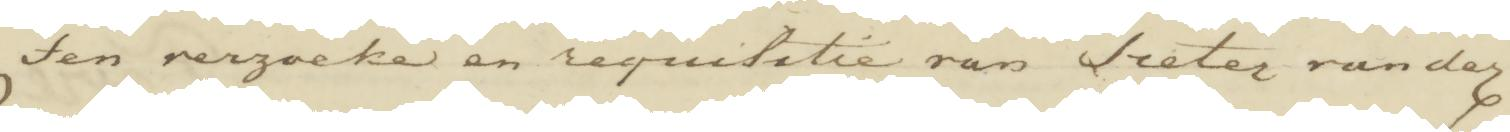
Ten verzoeke en requisitie van Pieter van der
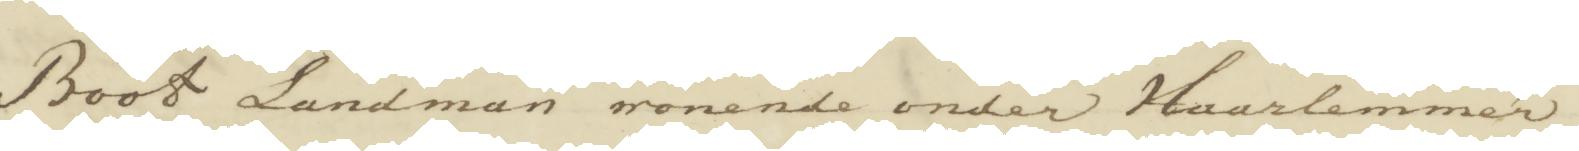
Boot Landman wonende onder Haarlemmer
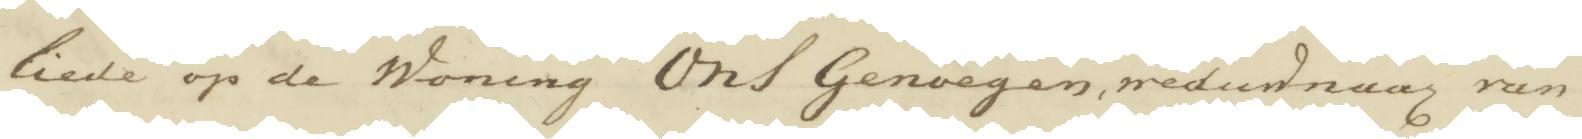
liede op de Woning Ons Genoegen, weduwnaar van
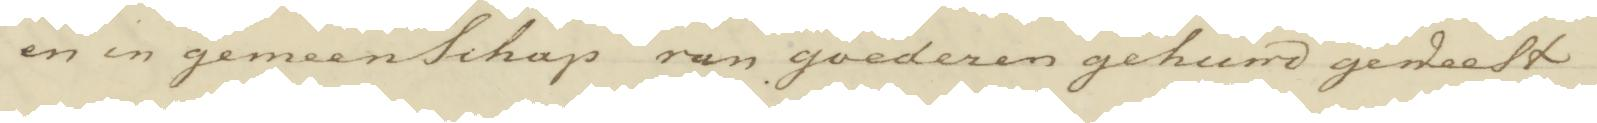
en in gemeenschap van goederen gehuwd geweest
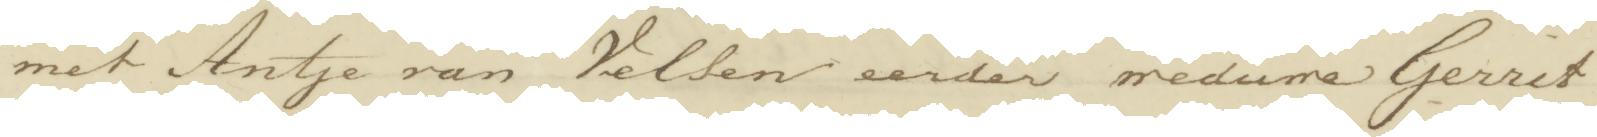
met Antje van Velsen eerder weduwe Gerrit
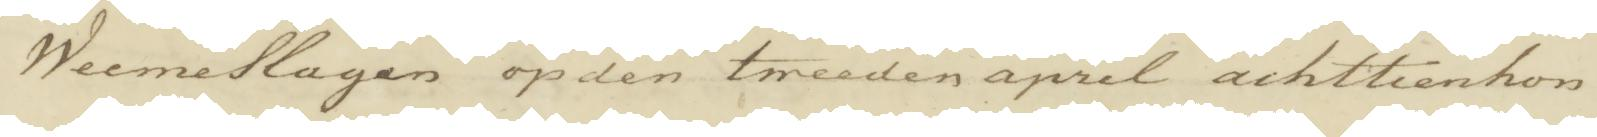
Weemeslagen op den tweeden april achttienhon
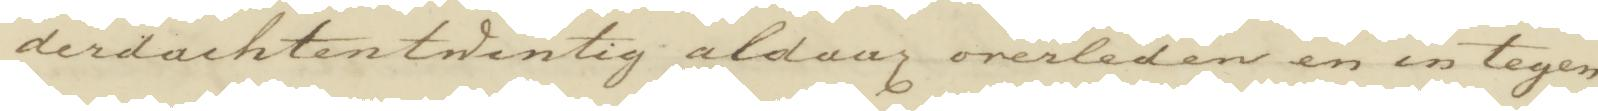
derdachten twintig aldaar overleden en in tegen
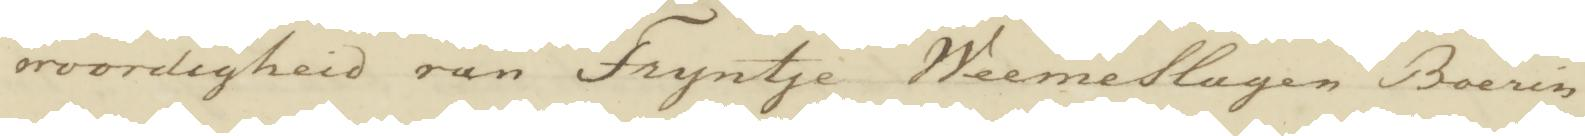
woordigheid van Tryntje Weemeslagen Boerin
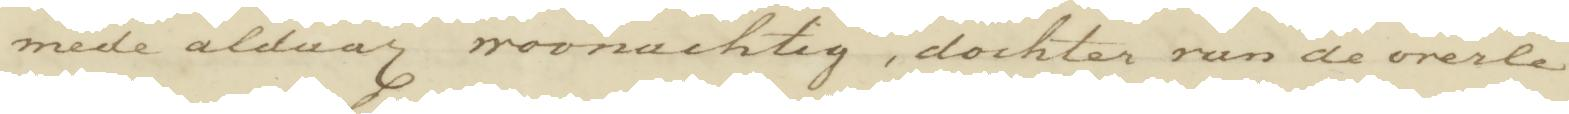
mede aldaar woonachtig, dochter van de overle
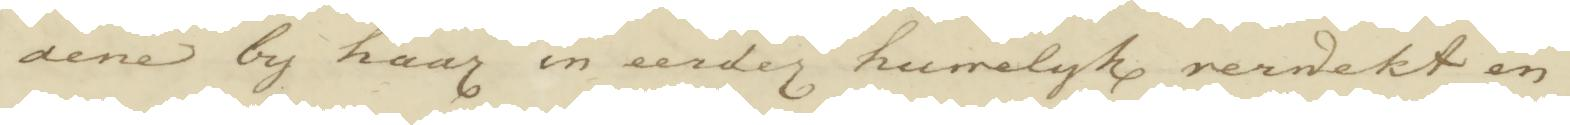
dene by haar in eerder huwelijk verwekt en
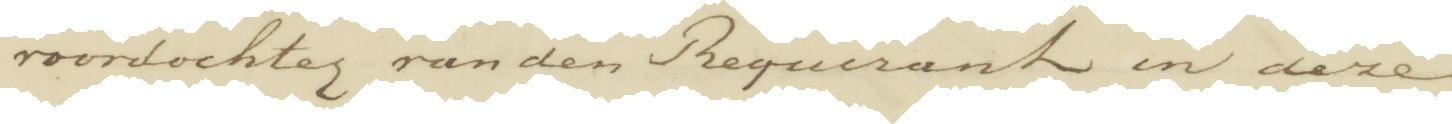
voordochter van den Requirant in deze
